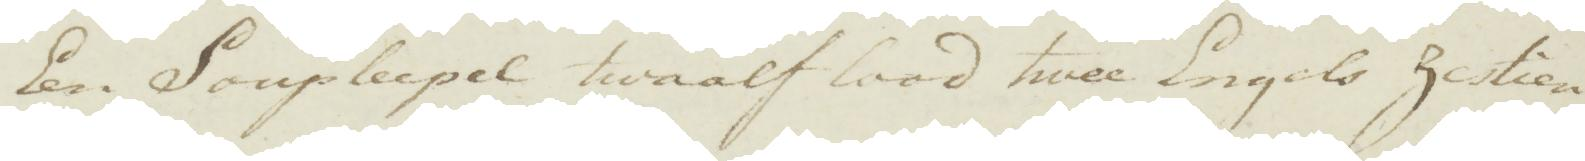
Een Soupleepel twaalf lood twee Engels zestien
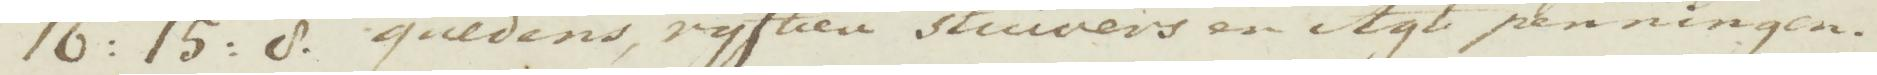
16:15:8. guldens, vyftien stuivers en Agt penningen.
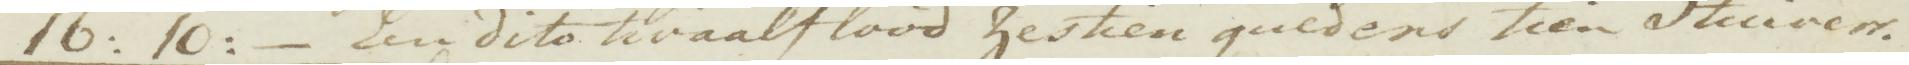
16:10:— Een dito twaalf lood zestien guldens tien Stuivers.
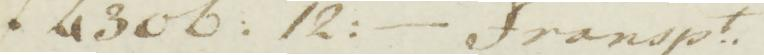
ƒ 4306:12:— Transp„t
